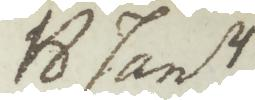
18 Jan.ij
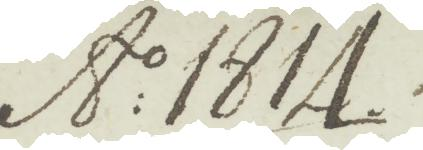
A:o 1814.
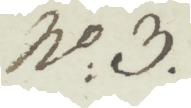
n:o 3.
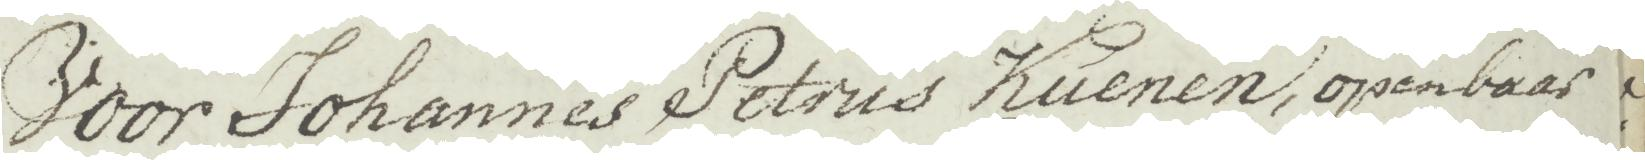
Voor Johannes Petrus Kuenen, openbaar
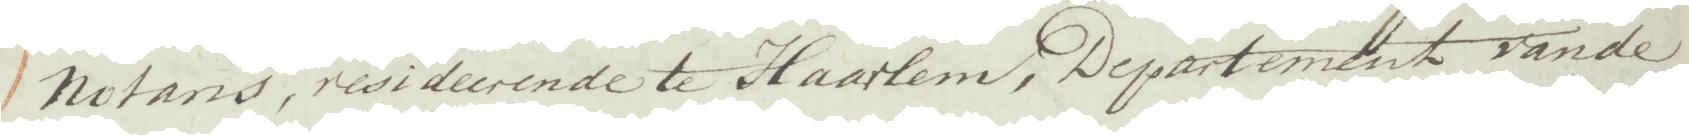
notaris, resideerende te Haarlem, Departement van de
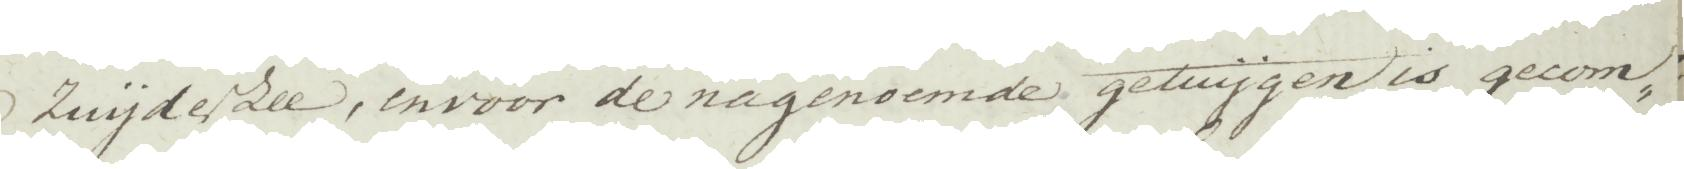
Zuijderzee, en voor de nagenoemde getuijgen is gecom„
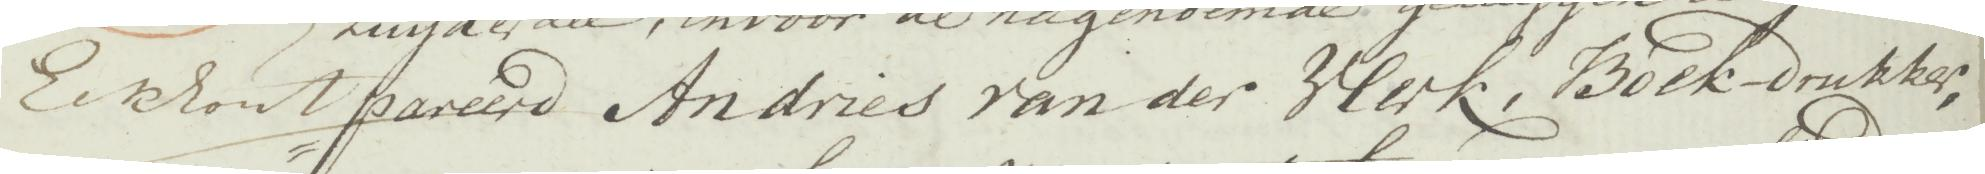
Eekhout =pareerd Andries van der Vlerk, Boek-drukker,
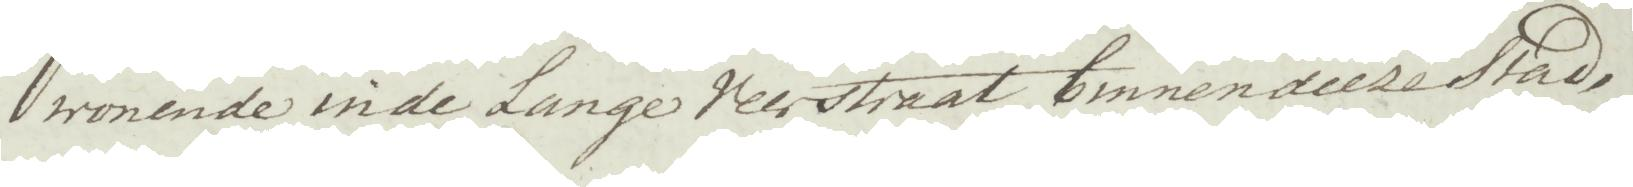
wonende in de Lange Veerstraat binnen deeze Stad,
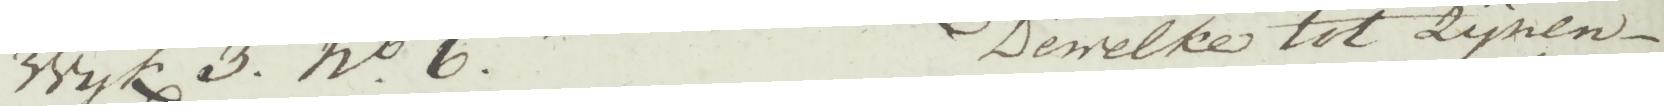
Wijk 3. n.o 6. Dewelke tot zijnen-
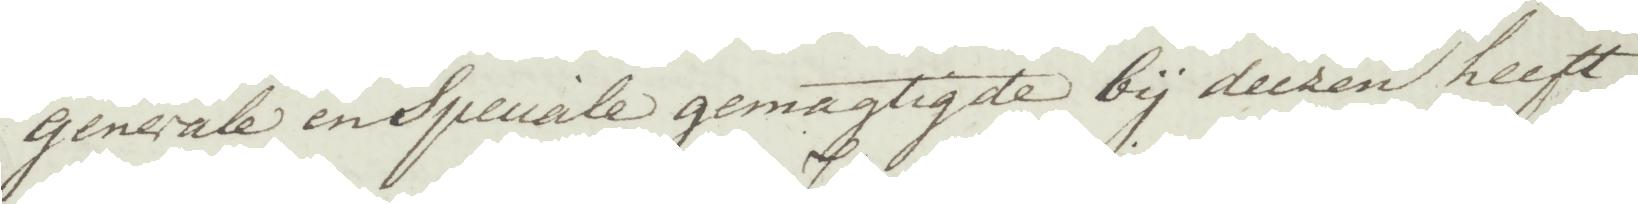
generale en Speciale gemagtigte bij deezen heeft
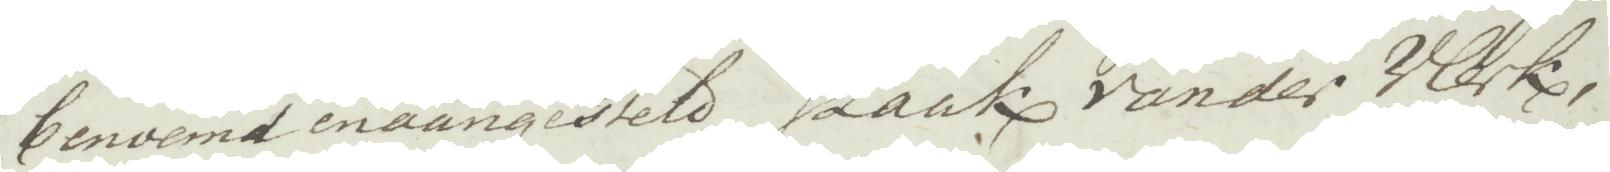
benoemd en aangesteld Izaak van der Vlerk,
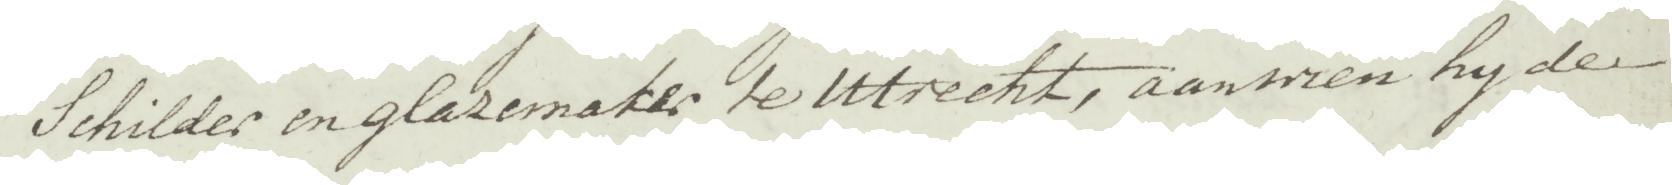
Schilder en glazemaker te Utrecht, aan wien hij de
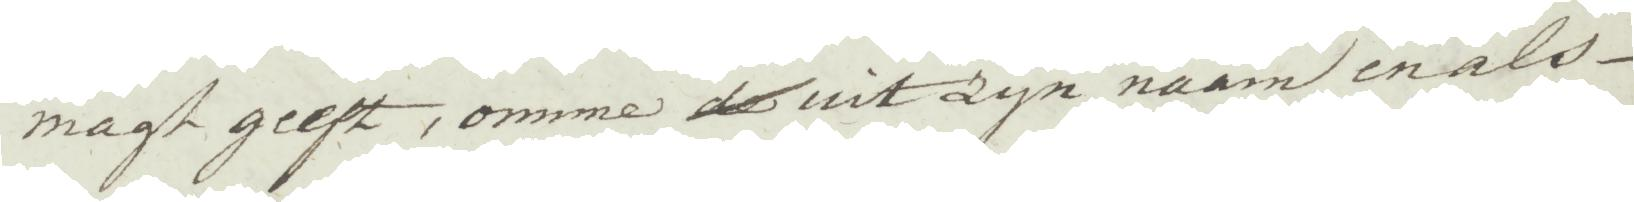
magt geeft , omme de uit zyn naam en als -
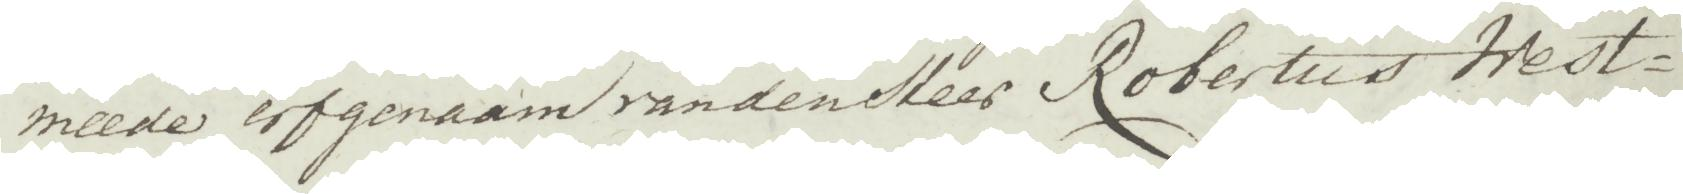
meede erfgenaam van den Heer Robertus West=
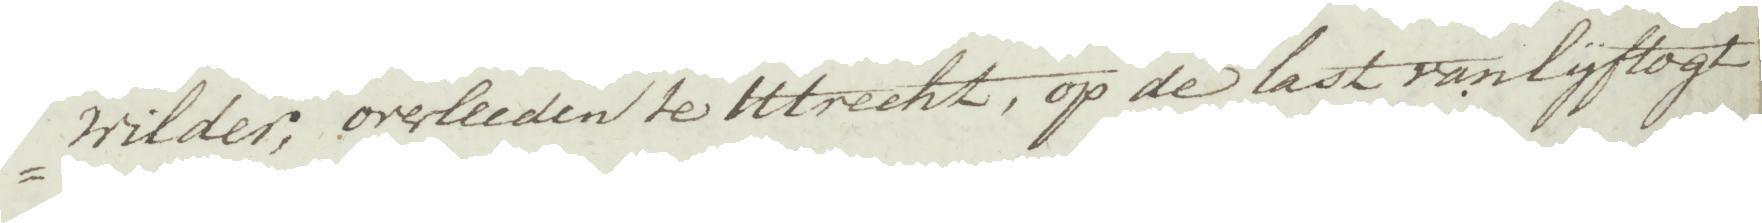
= wilder; overleeden te Utrecht, op de last van lijftogt
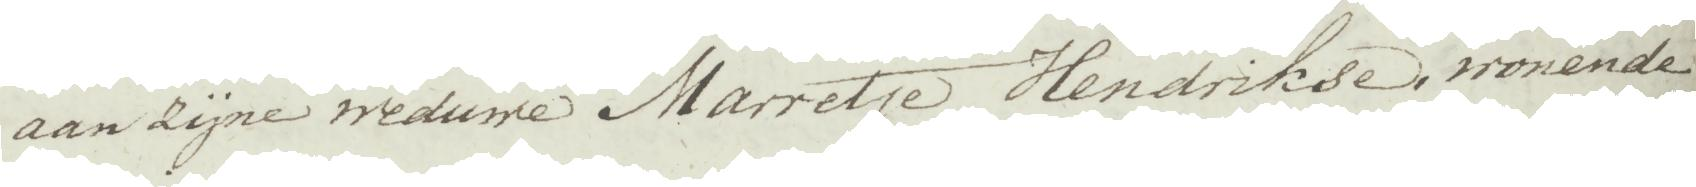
aan zijne weduwe Marretje Hendrikse, wonende
